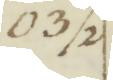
03½
